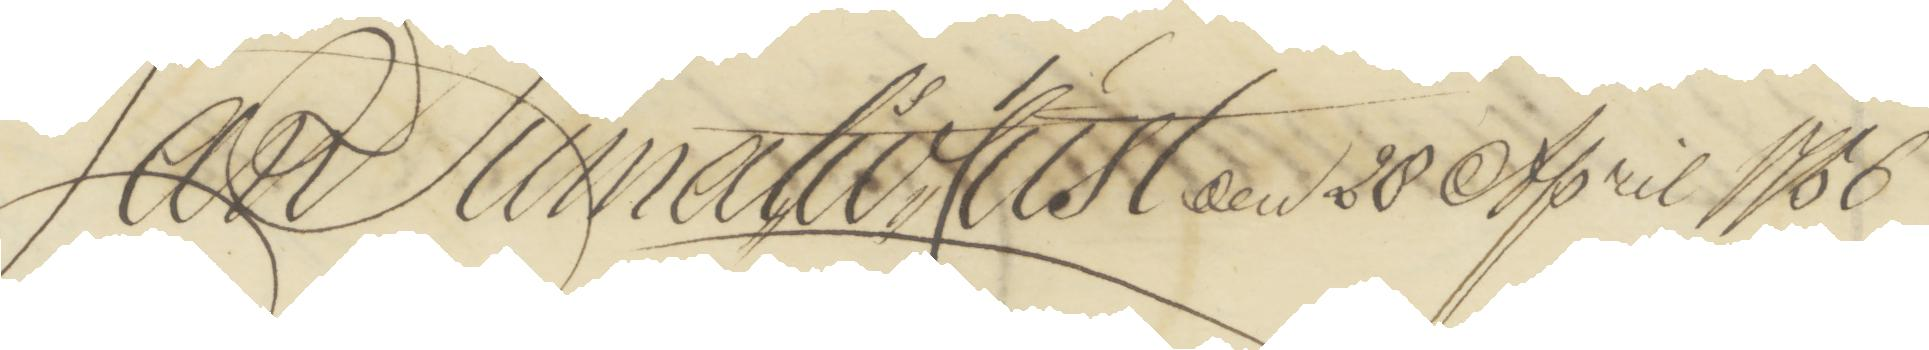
Van Sumat„s W„t Cust den 28 April 1756
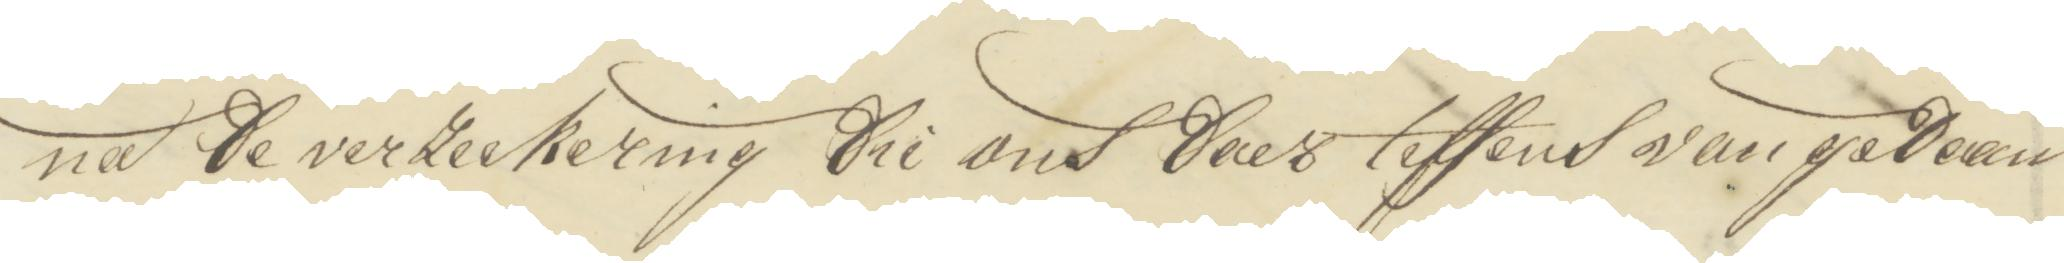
na de verzeekering die ons daer teffens van gedaan
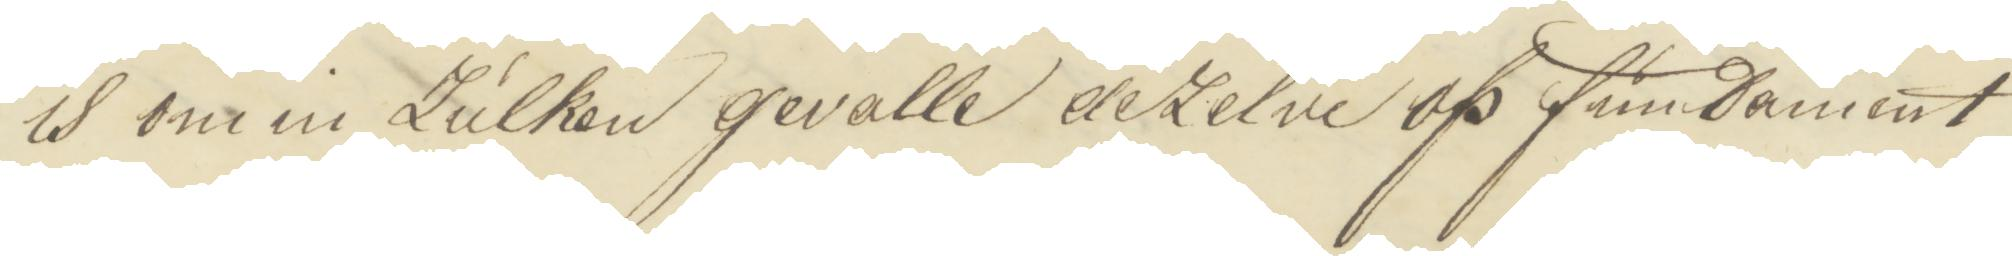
is om in zulken gevalle dezelve op fundament
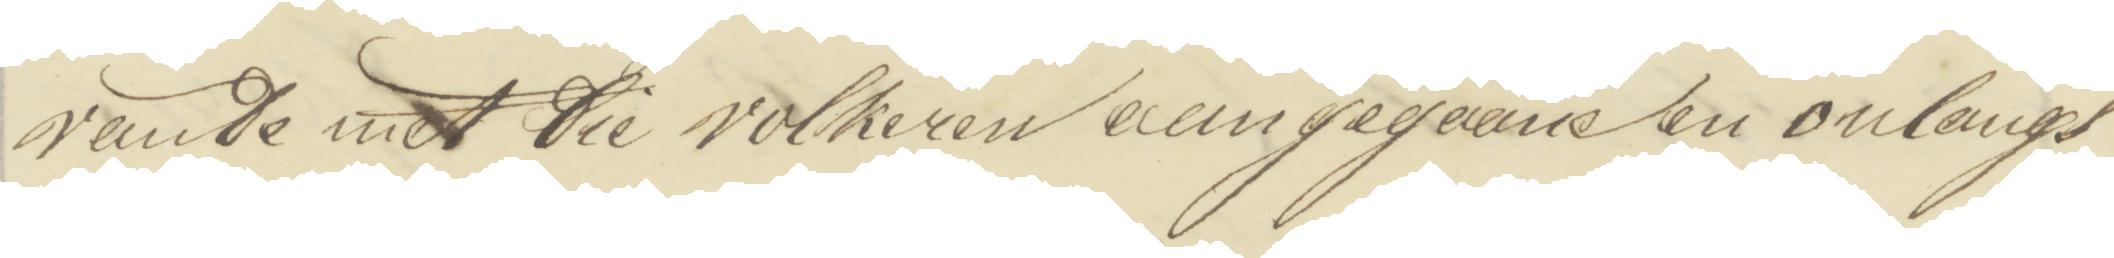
vande met die volkeren aan gegaane en onlangs
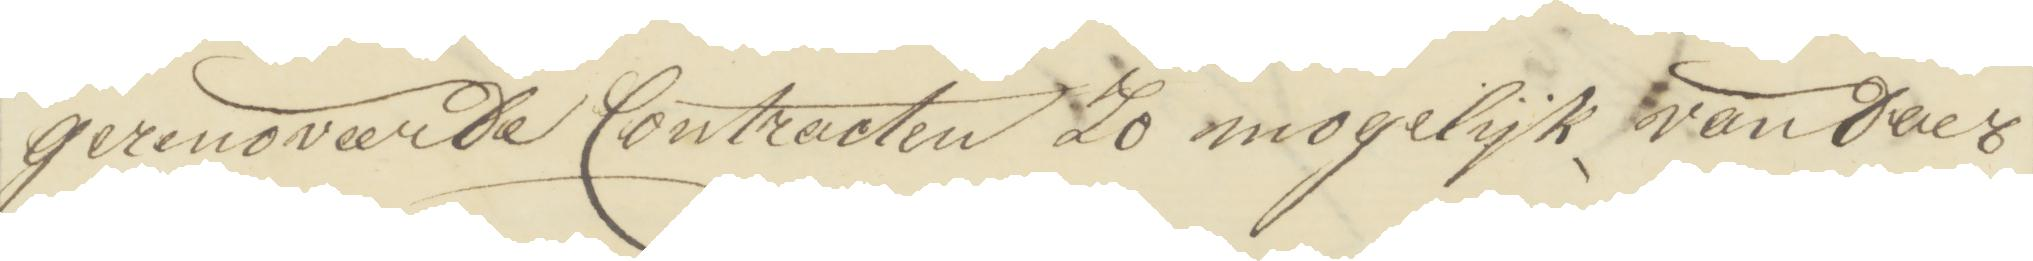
gerenoveerde contracten Zo mogelijk van daer
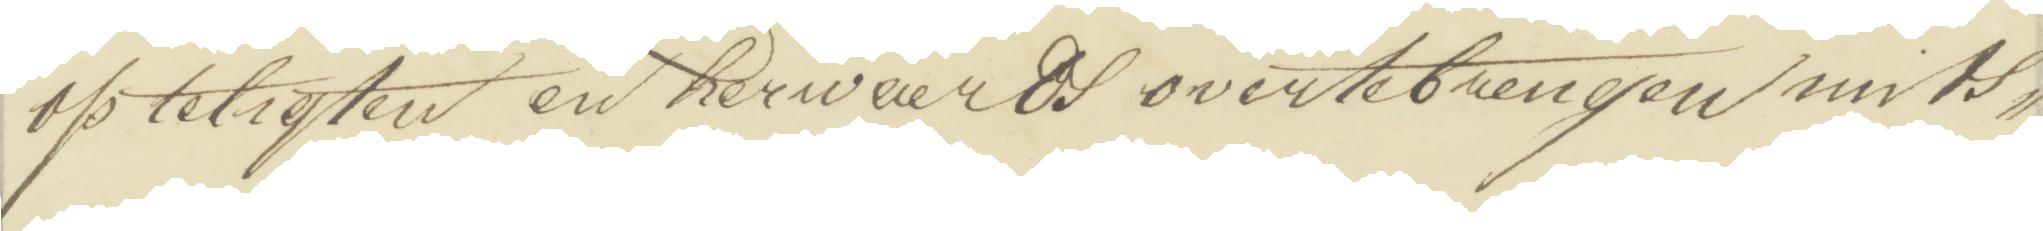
op te ligten en herwaerds over te brengen mits„
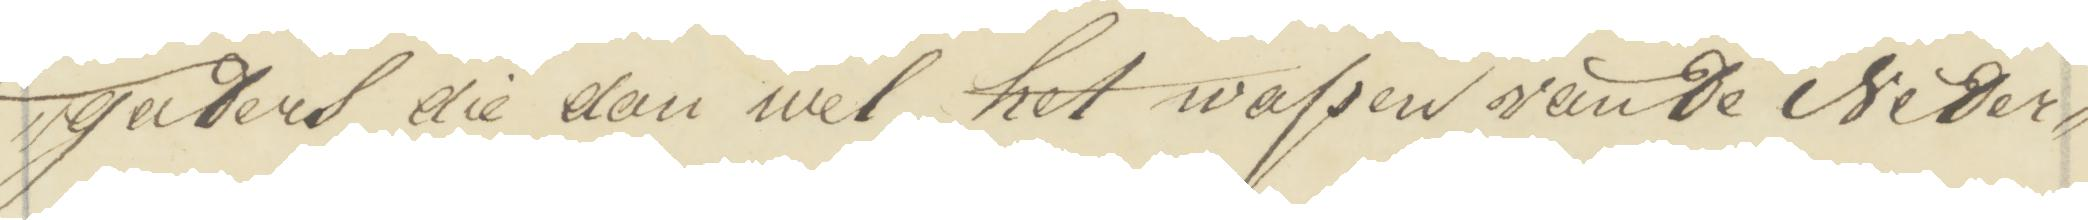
gaders die dan wel het wapen van de Neder„
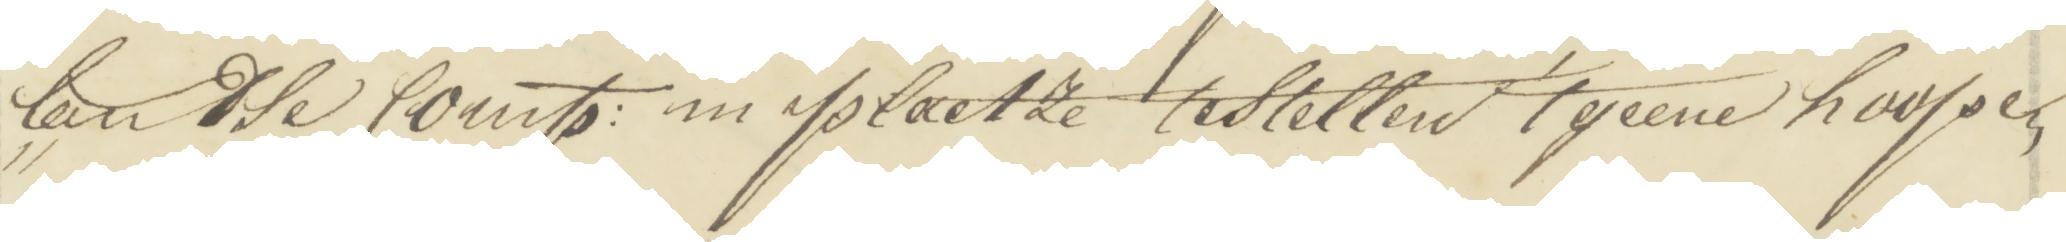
landse Comp: in plaetze testellen 't geene hoope,
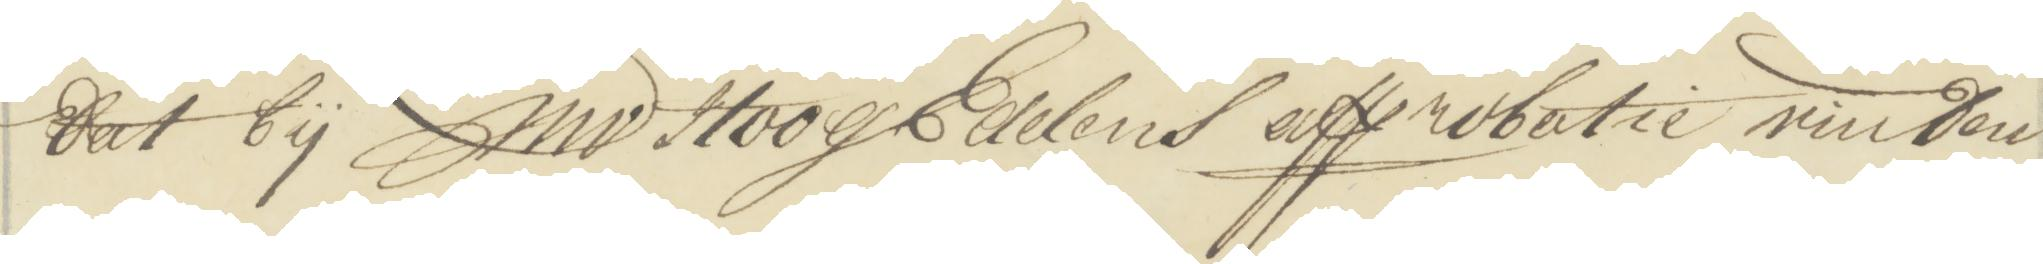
dat bij UW Hoog Edelens approbatie vinden
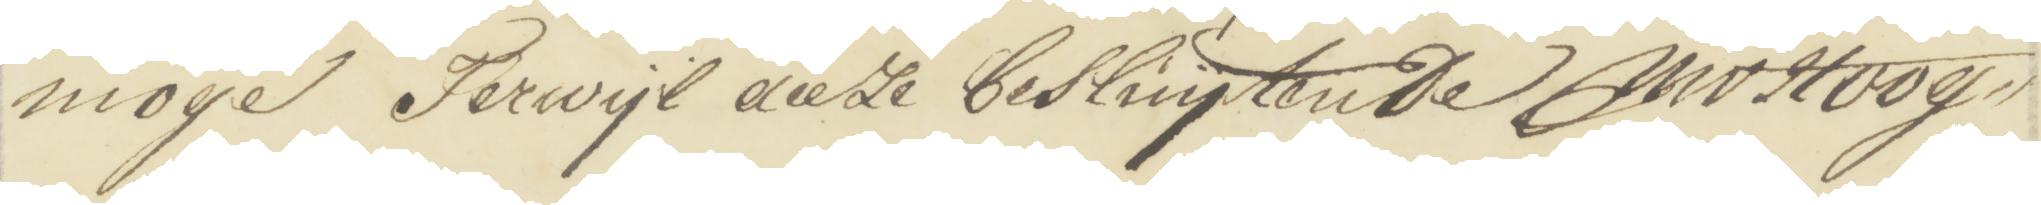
moge Terwijl deze besluijtende UW Hoog„
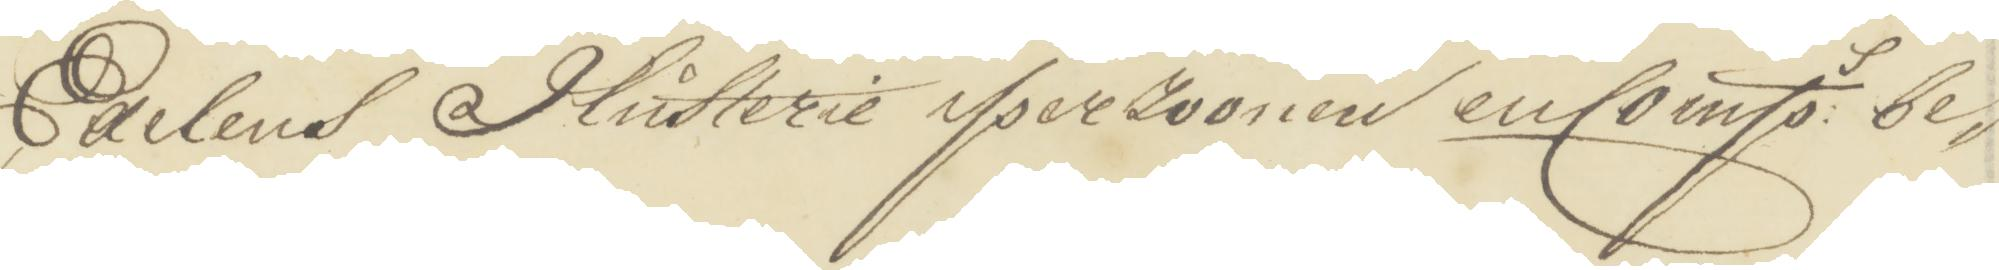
Edelens Husterie perzoonen en Comp:s be=
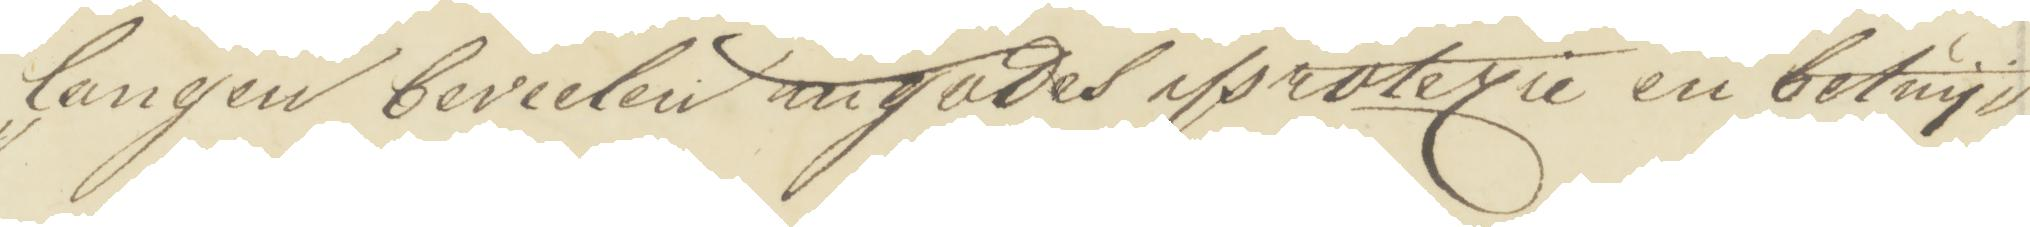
langen beveelen ingades protexie en betuij„
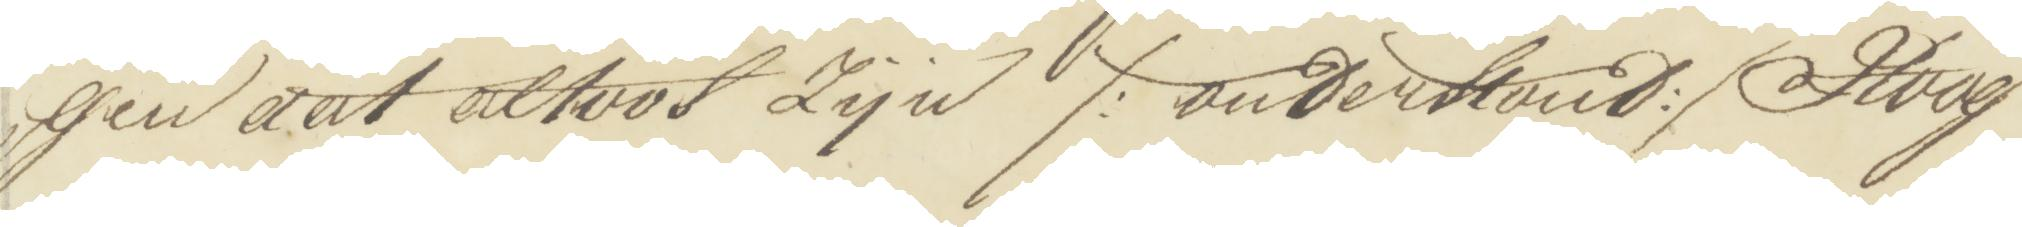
gen dat altoos Zijn /: onderstond:/ Hoog
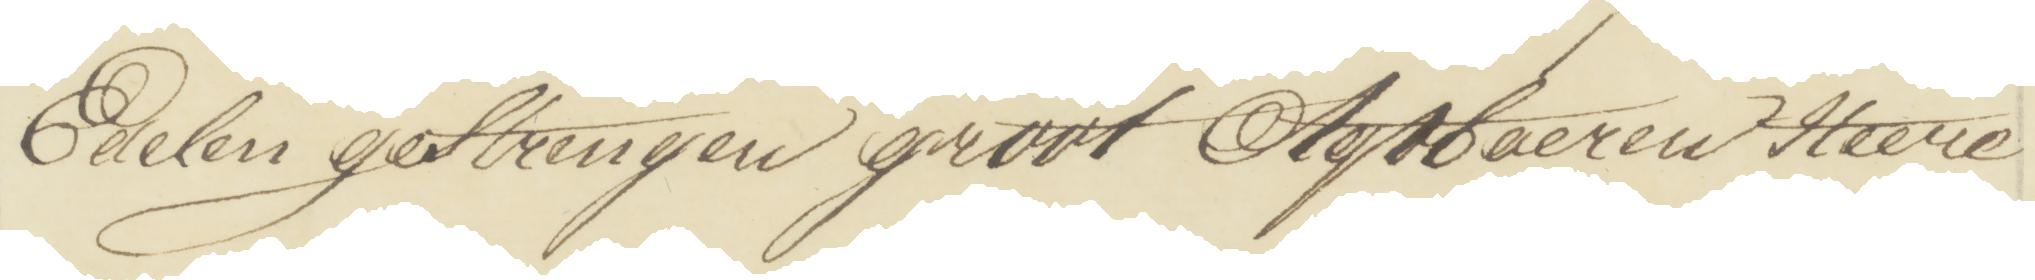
Edelen gestrengen groot agtbaeren Heere
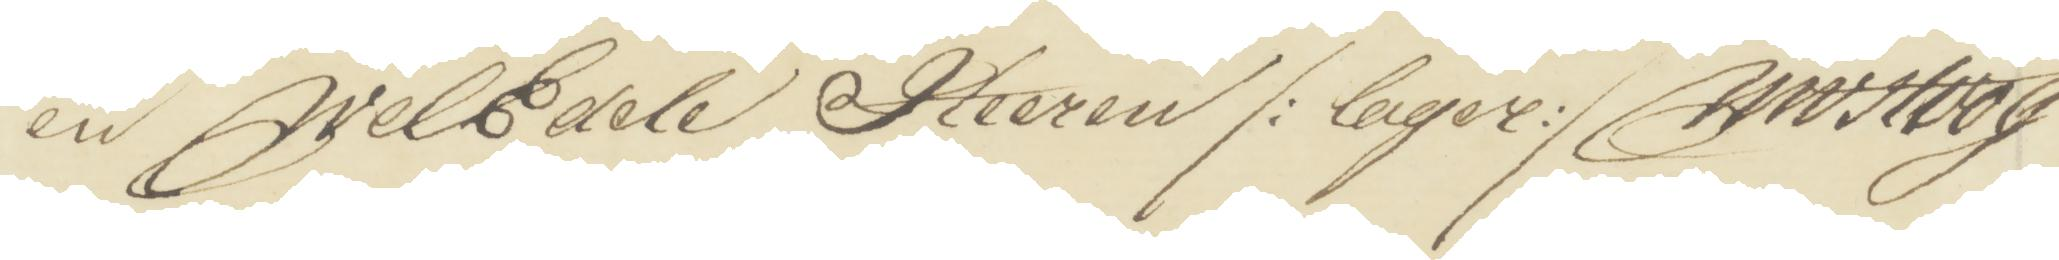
en Wel Edele Heeren /:lager:/ UW Hoog
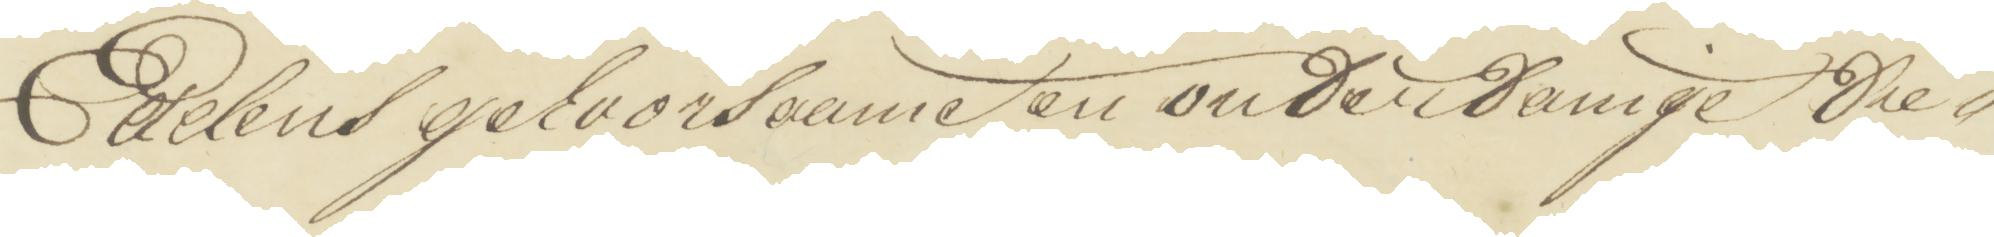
Edelens gehoorsaame en onderdanige Die
